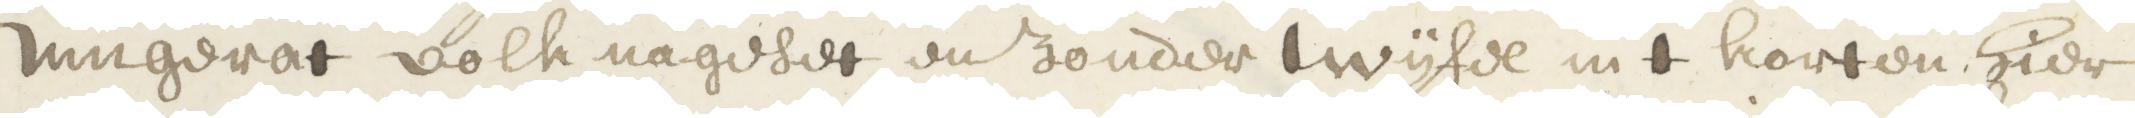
Ningerat volk nageset en zonder twijfel in t korten hier
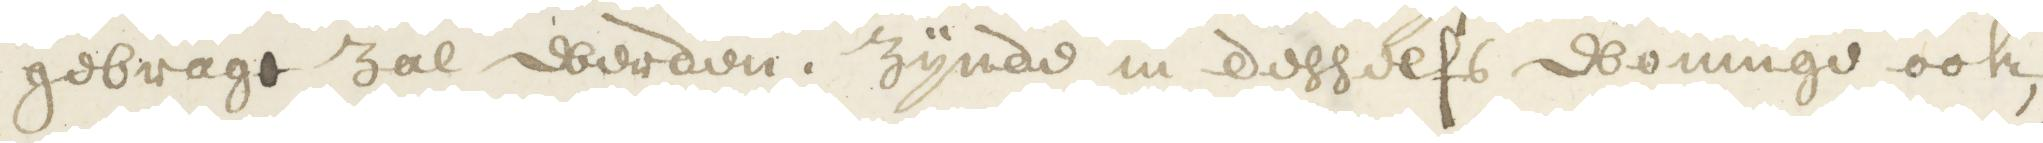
gebragt zal werden, zijnde in desselfs woninge ook
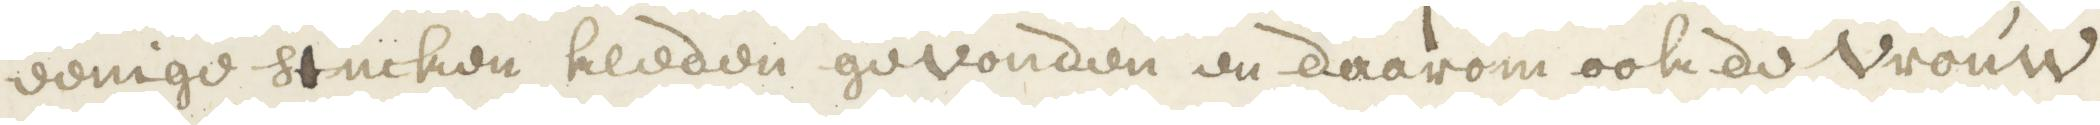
eenige stucken kleden gevonden en daarom ook de vrouw
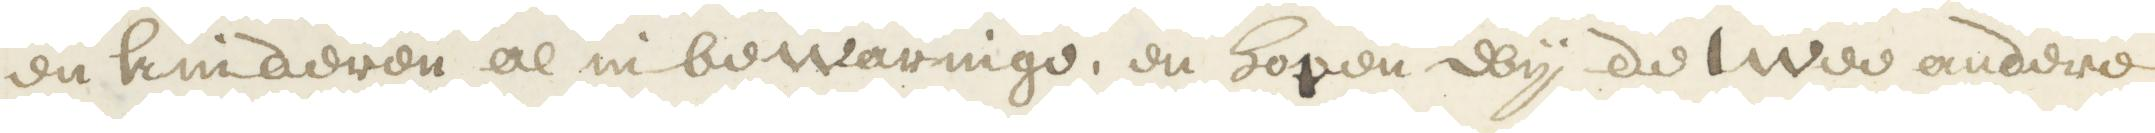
en kinderen al in bewaringe, en hopen wij de twee andere
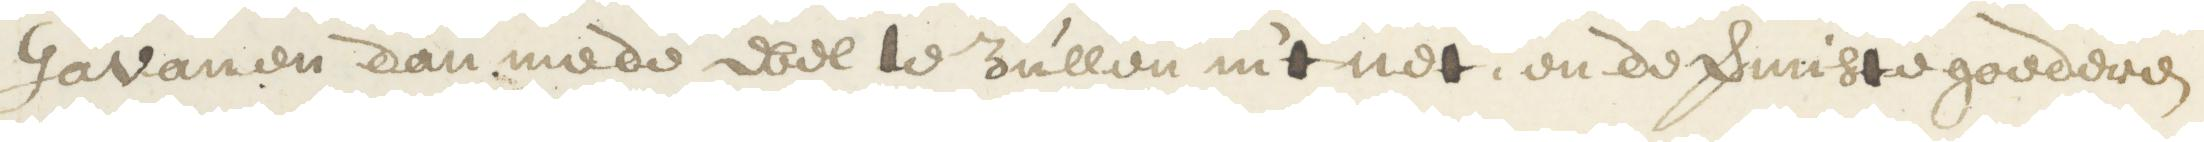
Javanen dan mede wel te zullen in 't net, en de vermiste goederen
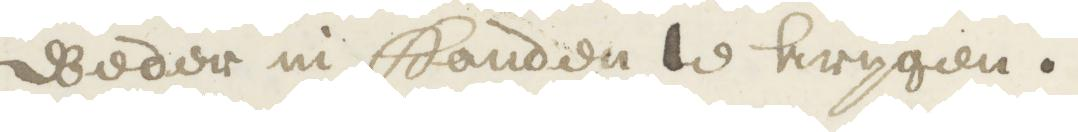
weder in Handen te krijgen.
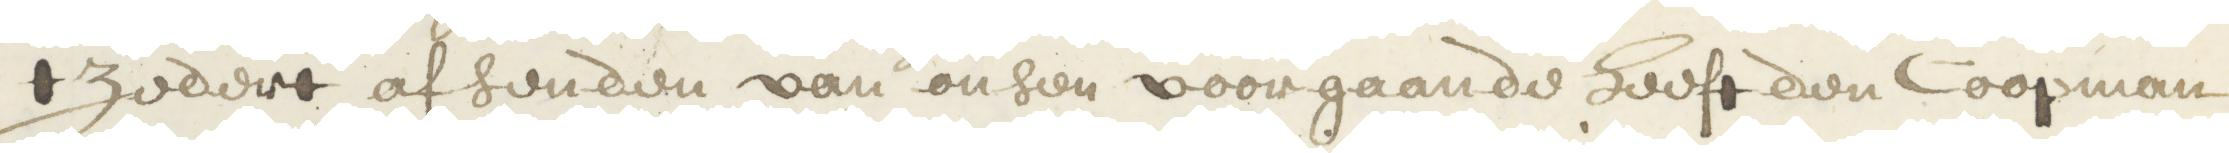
t Zedert afsenden van onsen voorgaande heeft den Coopman
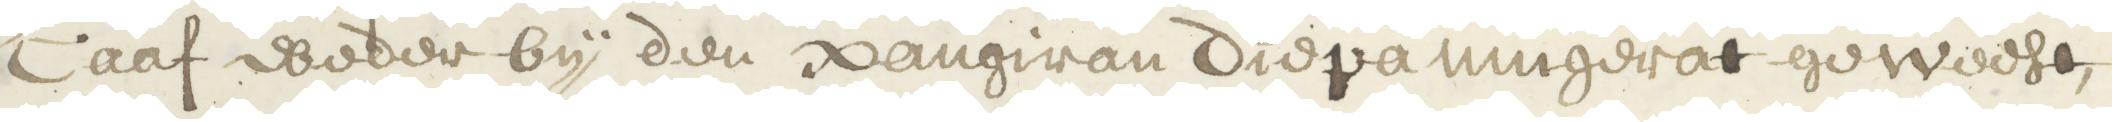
Caaf weder bij den pangiran diepa ningerat geweest,
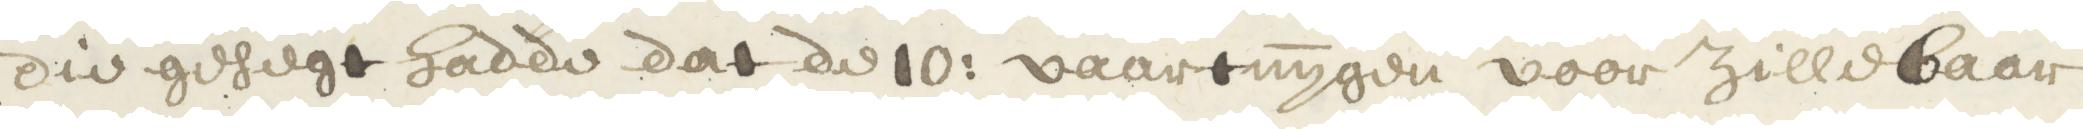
die gesegt hadde dat de 10: vaartuijgen voor zillebaar
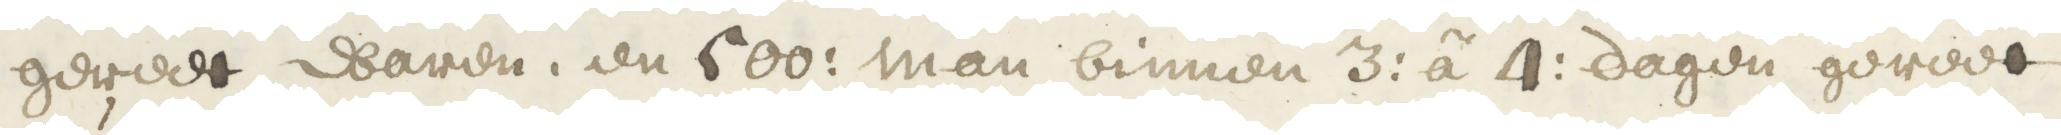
gereet waren, en 500: man binnen 3: á 4: dagen gereet
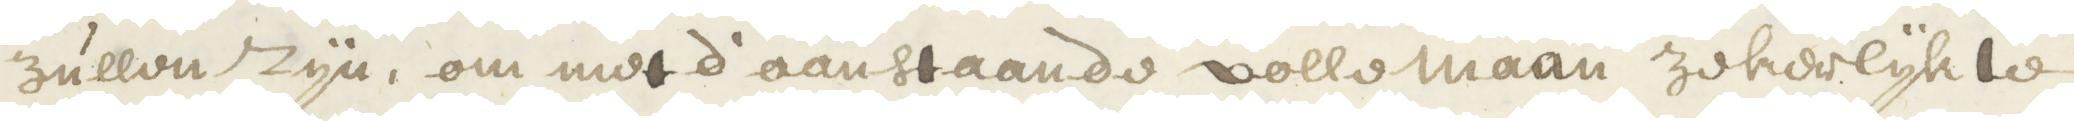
zullen zijn, om met d’ aanstaande volle maan zekerlijk te
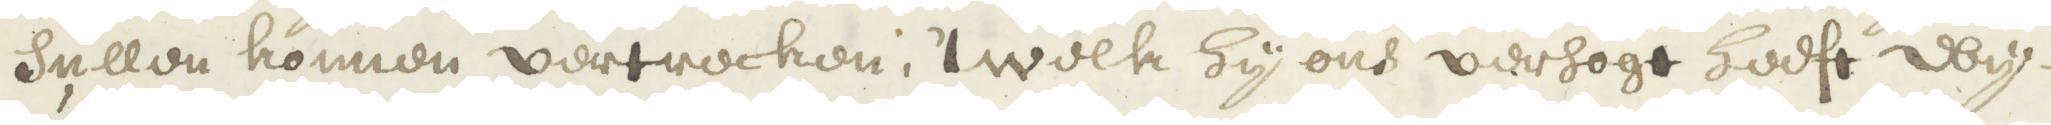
sullen konnen vertrecken, 't welk hij ons versogt heeft wij
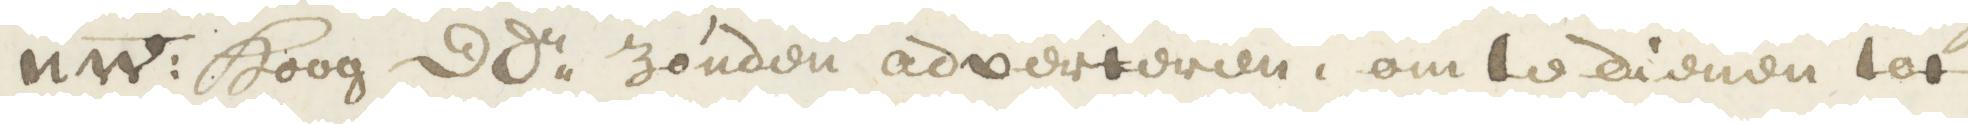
UW: Hoog Ed„en zouden adverteren, om te dienen tot
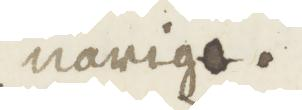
narigt.
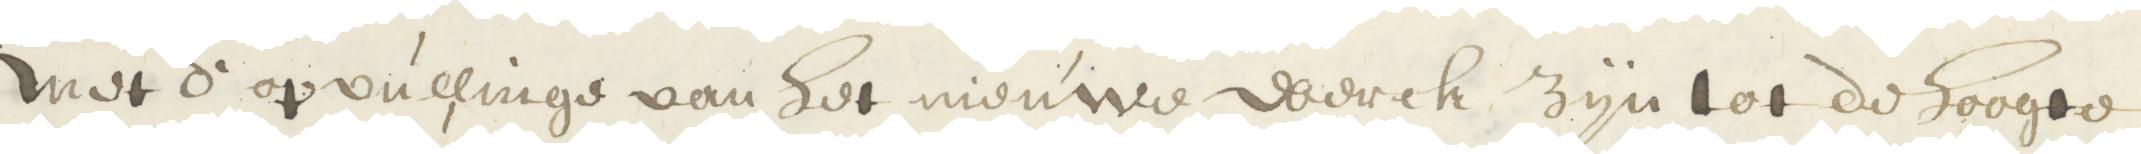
met d’ opvullinge van het nieuwe werck zijn tot de hoogte
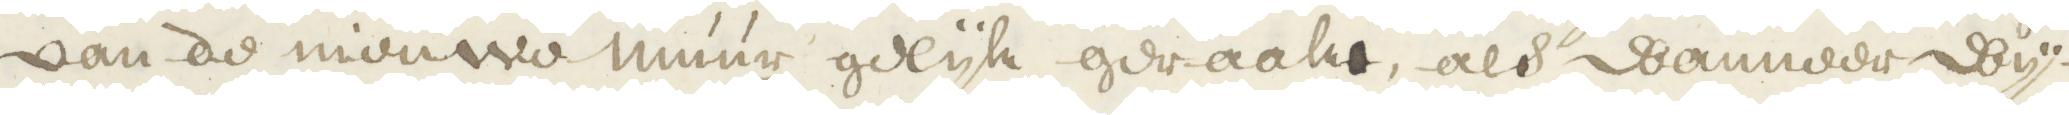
van de nieuwe muur gelijk geraakt, als wanneer wij
